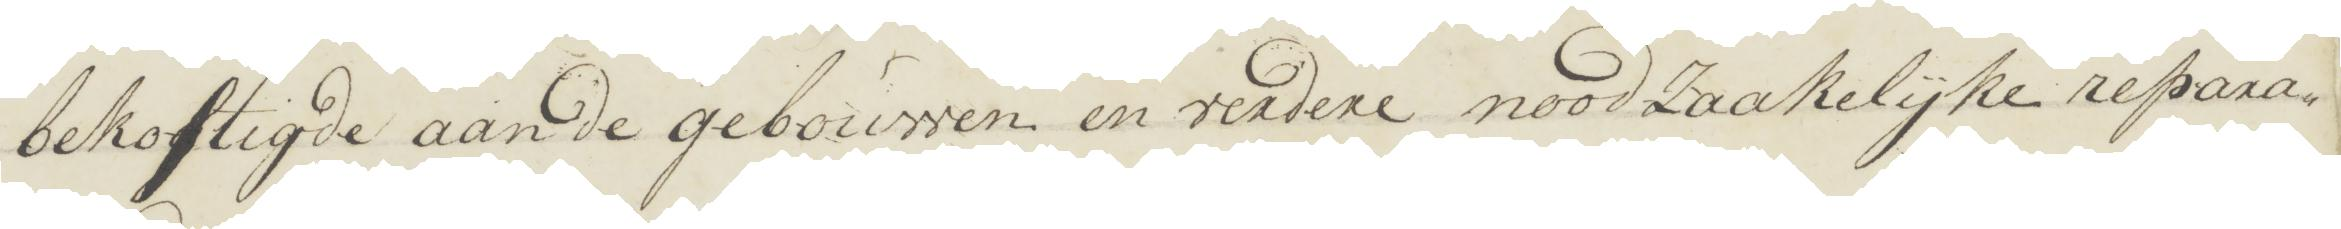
bekostigde aan de gebouwen en verdere noodzaakelijke repara„
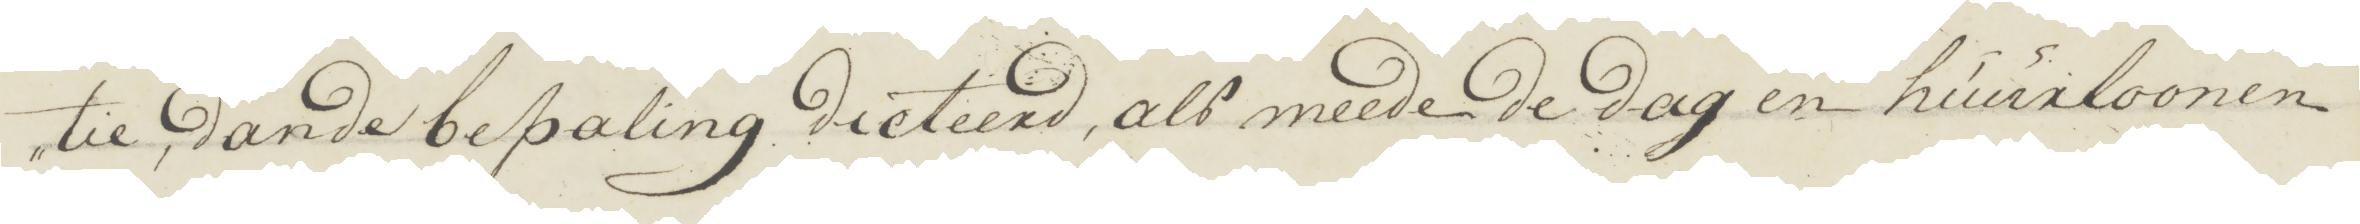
„tie, dan de bepaling dicteerd, als meede de dag en huurloonen
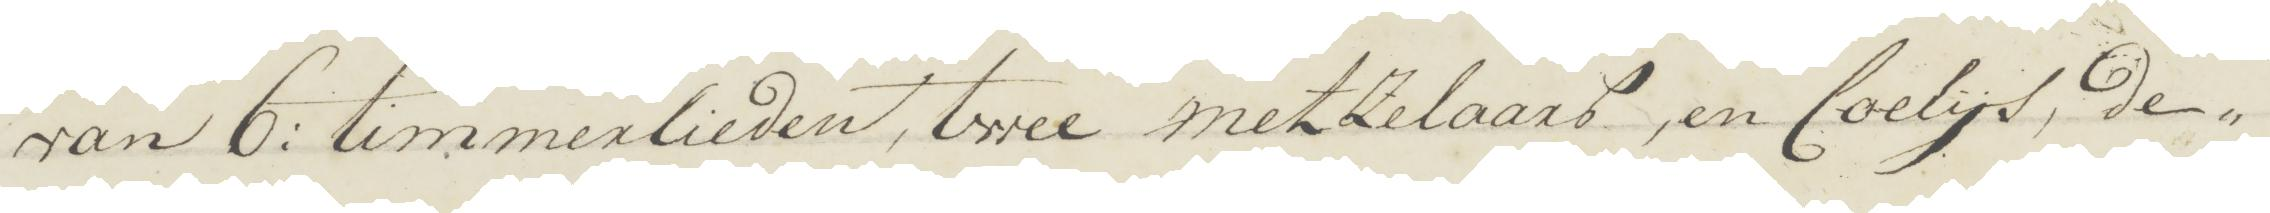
van 6: timmerlieden, twee metzelaars, en Coelijs, de„
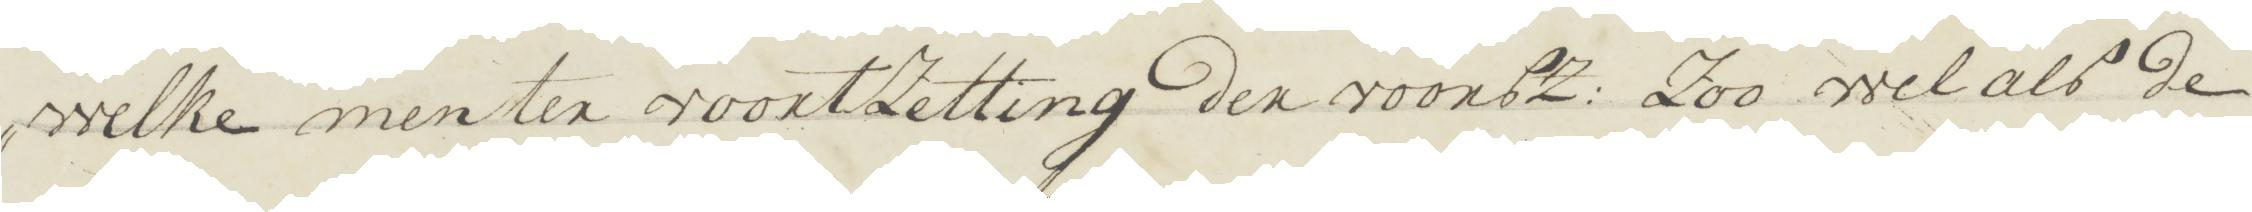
welke men ter voortzetting der voorsz: zoo wel als de
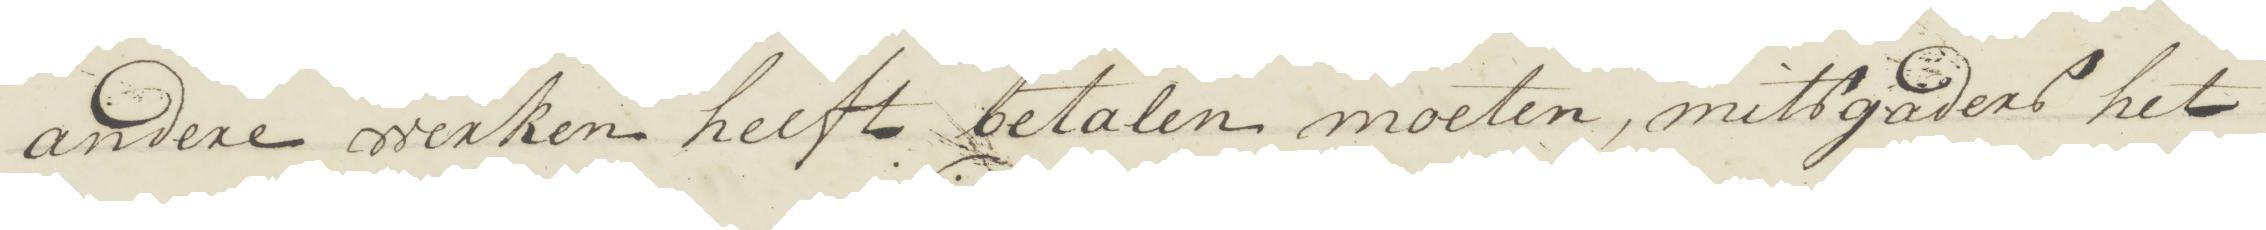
andere werken heeft betalen moeten, mitsgaders het
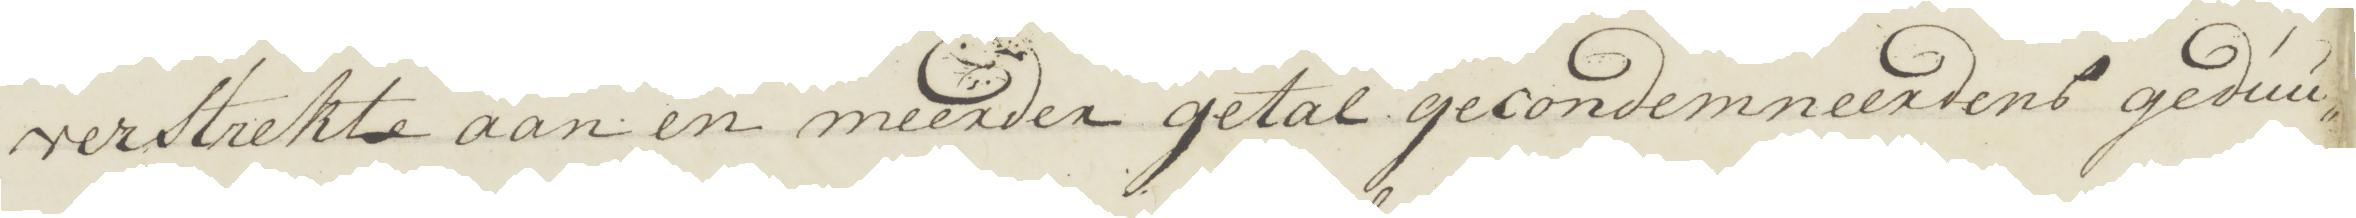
verstrekte aan en meerder getal gecondemneerdens geduu„
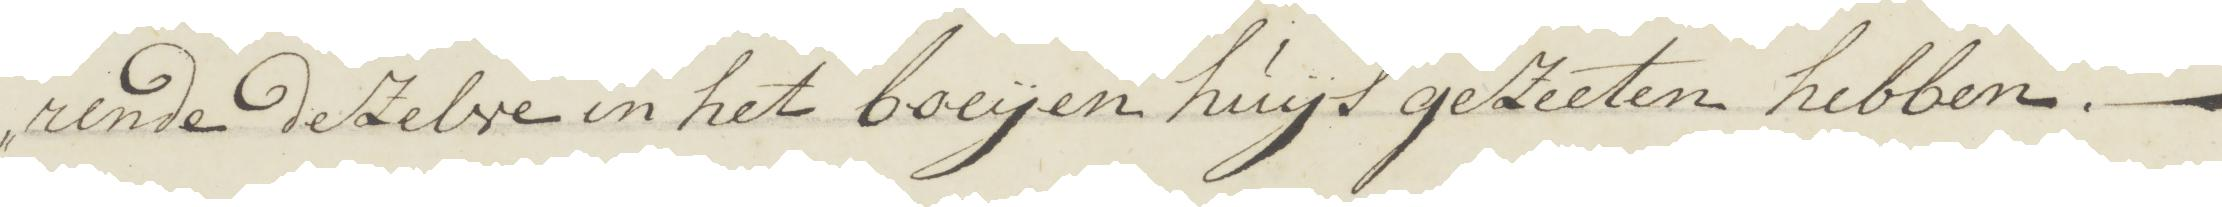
„rende dezelve in het boeijen huijs gezeeten hebben.—
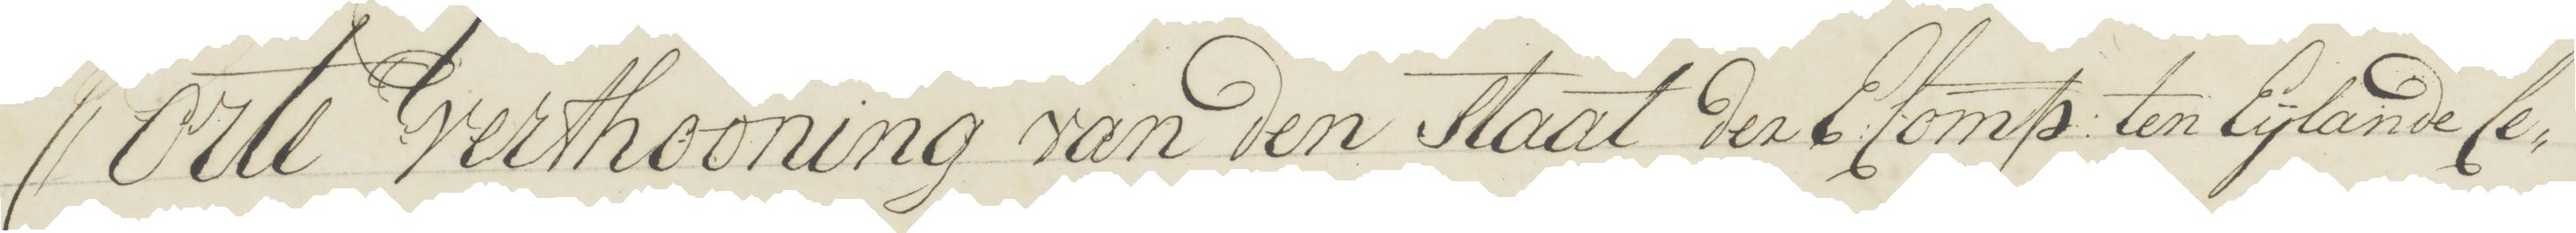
Corte Verthooning van den staat der E: Comp: ten Eijlande Ce„
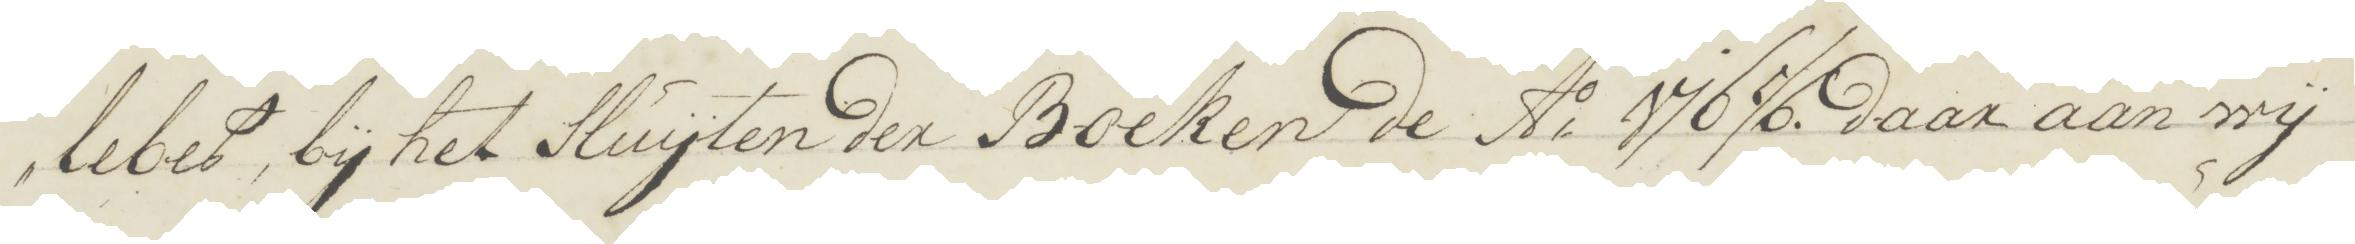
„lebes, bij het sluijten der Boeken de A„o 176 5/6. daar aan wij
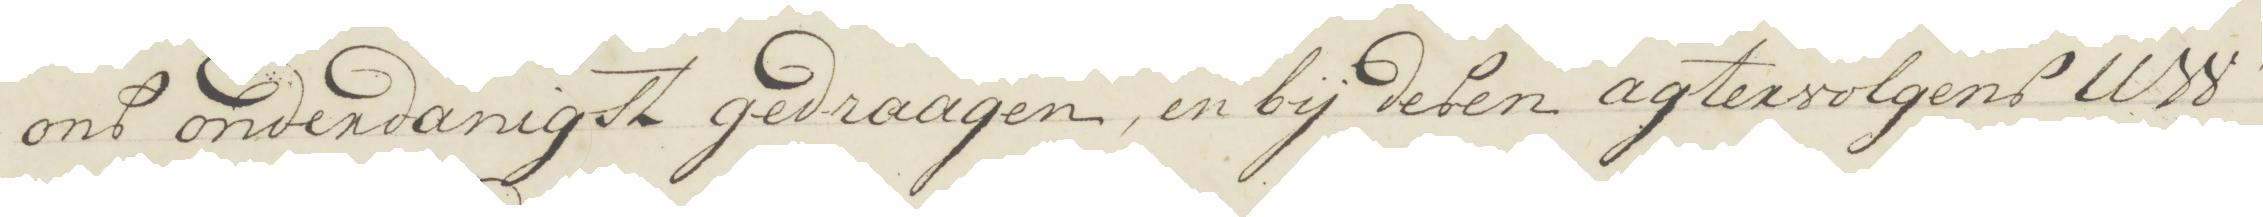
ons onderdanigst gedraagen, en bij desen agtervolgens uw:
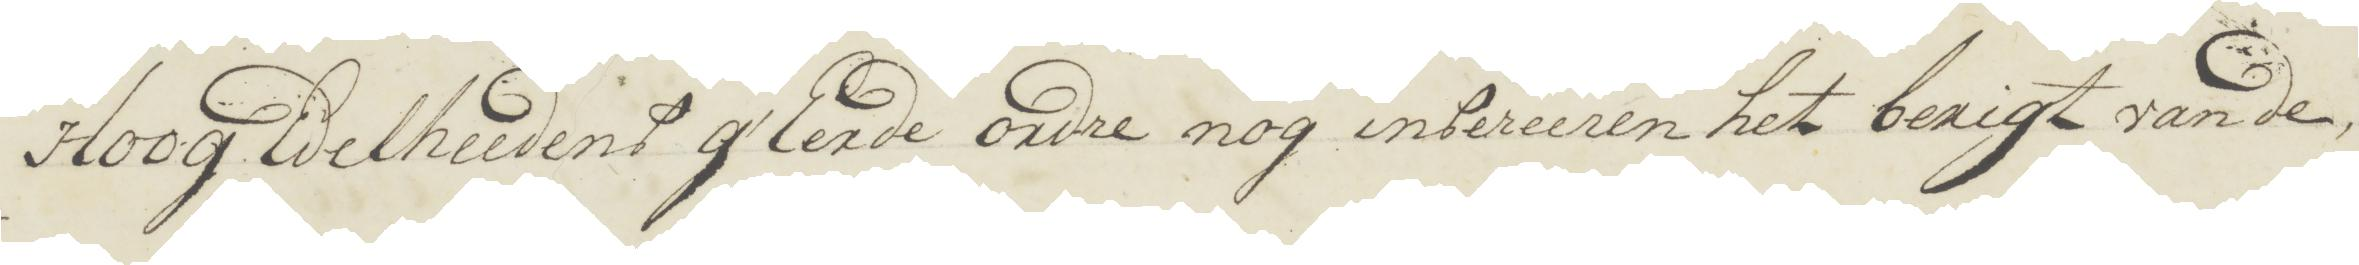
Hoog Edelheedens g’Eerde ordre nog insereeren het berigt van de.
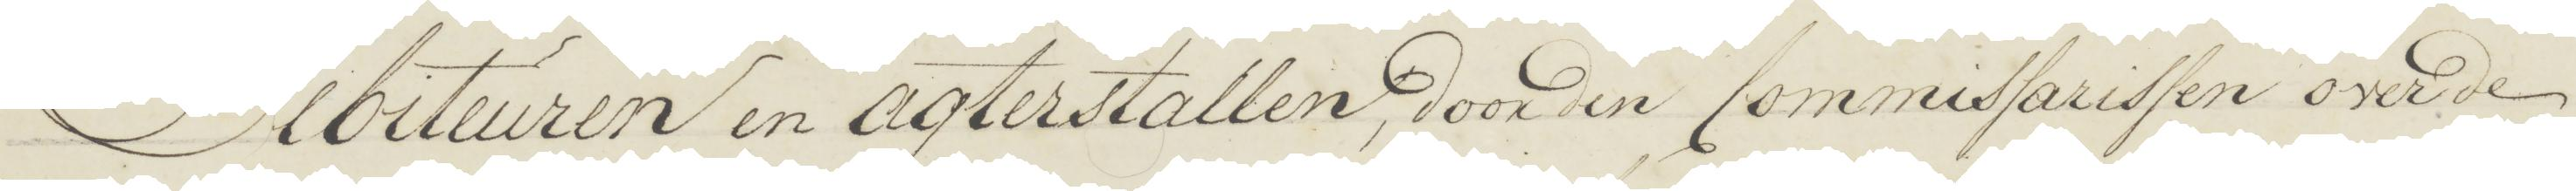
Debiteuren en agterstallen, door den Commissarissen over de
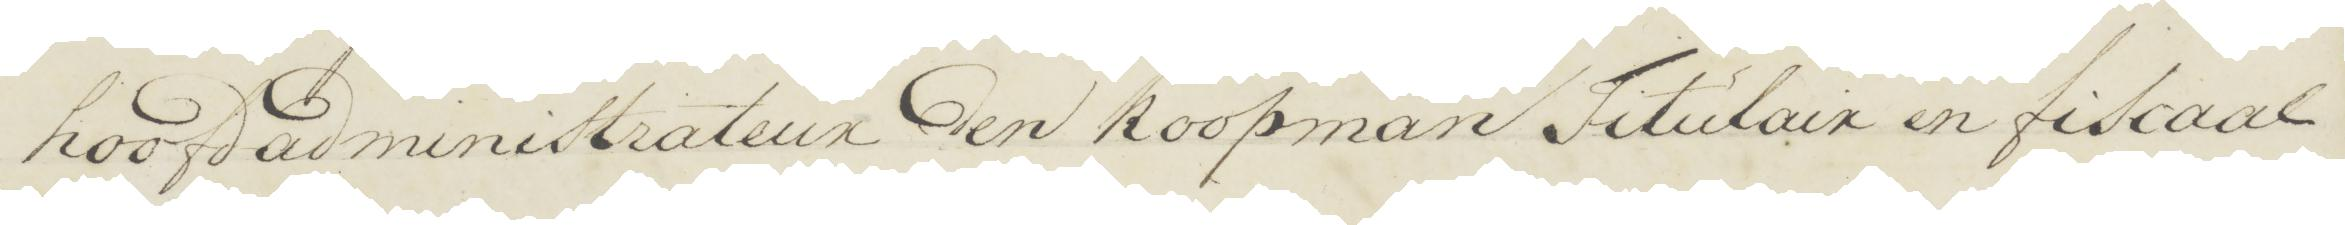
hoofd administrateur den koopman Titulair en fiscaal
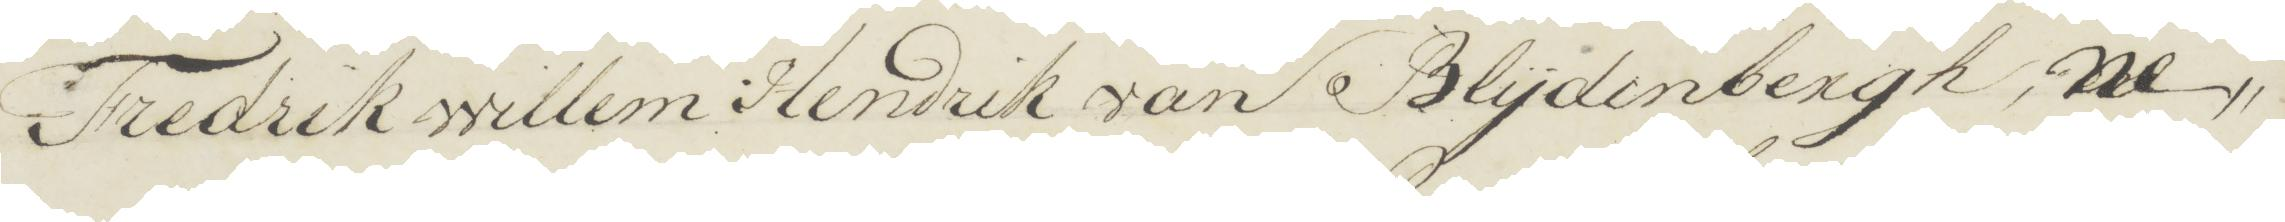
Fredrik willem Hendrik van Blijdenbergh, ne„
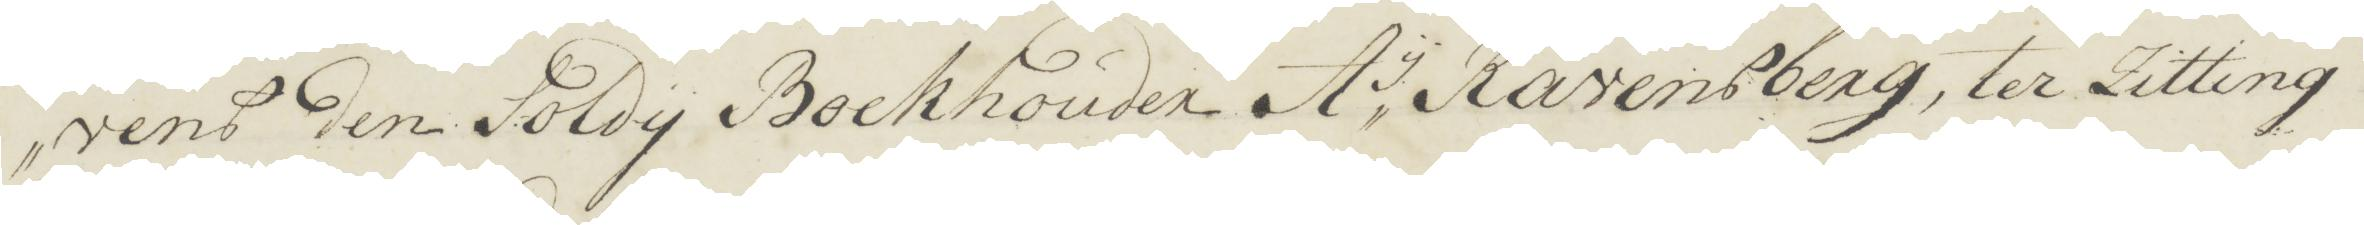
„vens den soldij Boekhouder A„ij Ravensberg, ter zitting
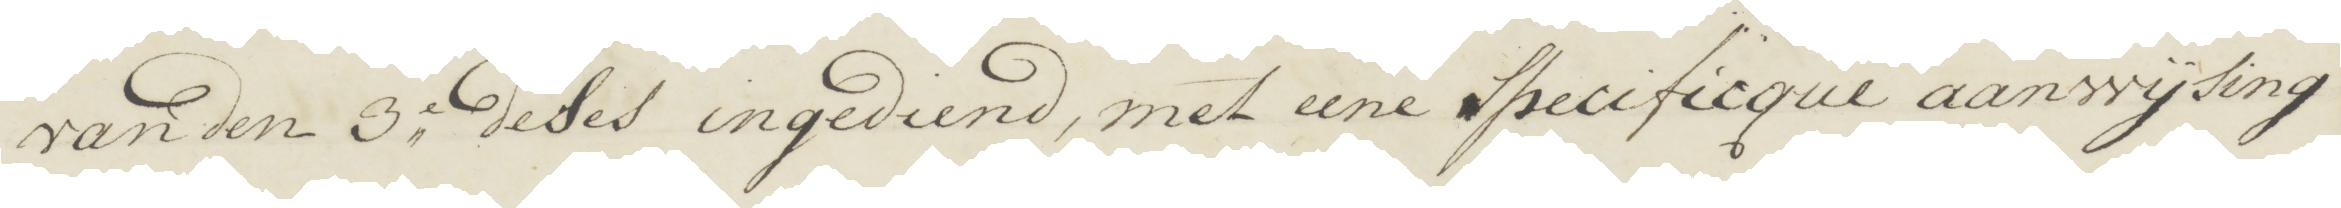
van den 3„e deses ingediend, met eene specificque aanwijsing
